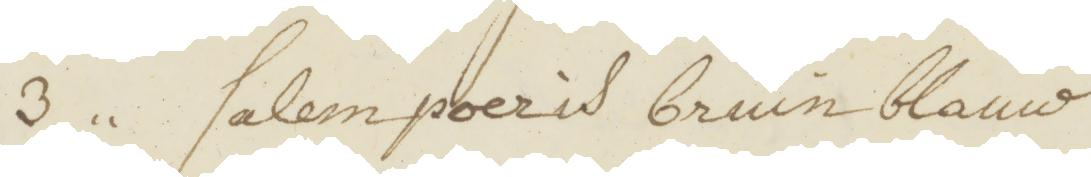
3 „ Salempoeris bruin blauw
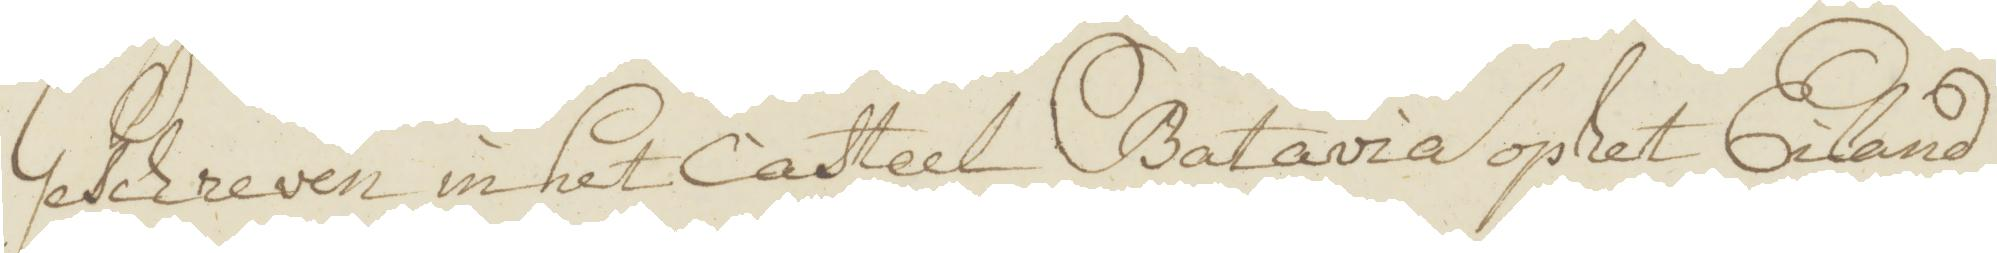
Geschreven in het Casteel Batavia op het Eiland
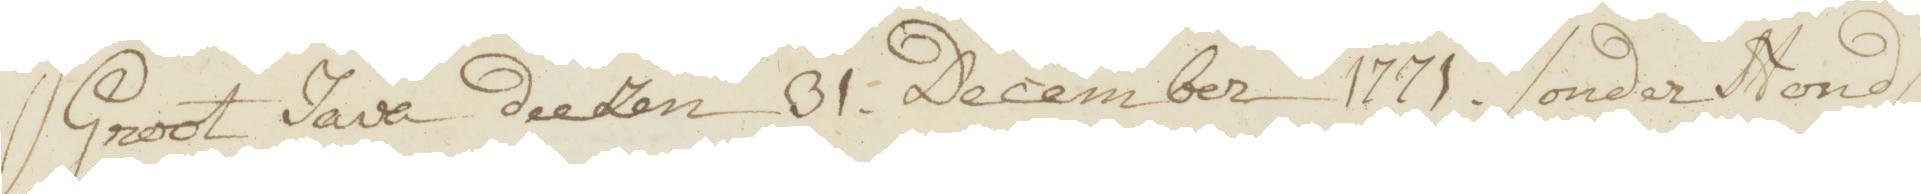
Groot Iava deezen 31. December 1771. / onderstond /
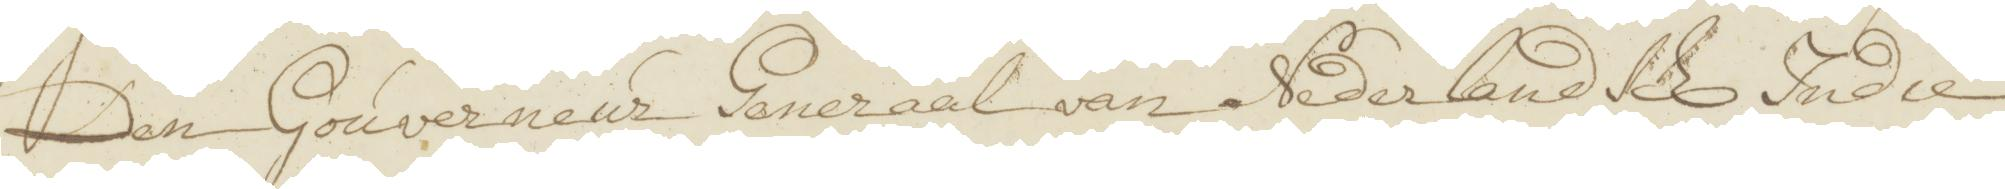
Den Gouverneur Generaal van Nederlandsch Indie
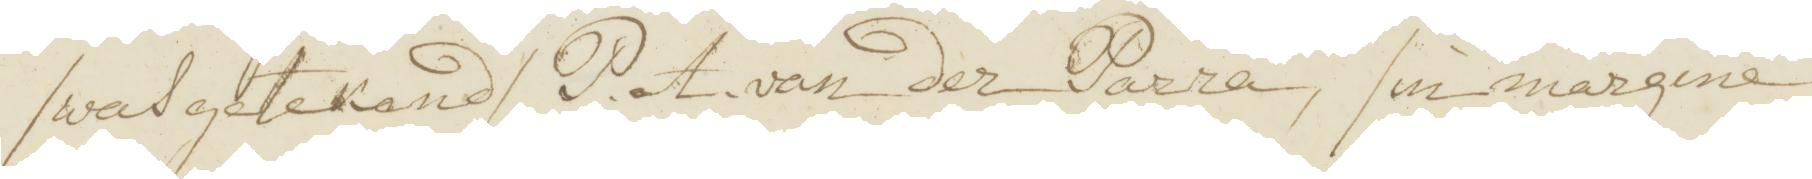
/ was getekend / Pet. van der Parra, / in margine
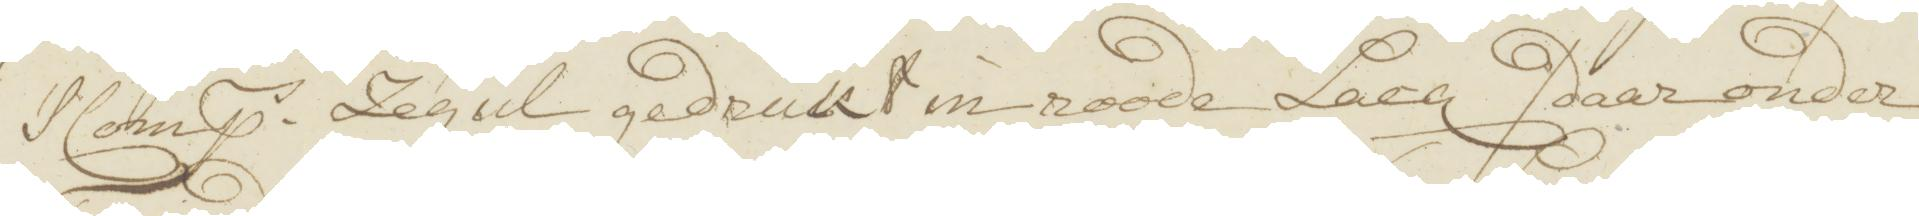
's Comp.s zegul gedrukt in roode Lacq / daar onder
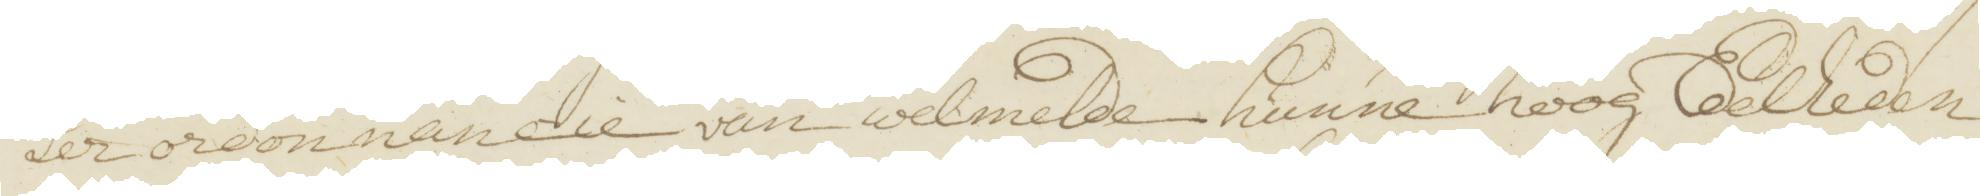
Ter ordonnancie van welmelde hunne hoog Edelheden
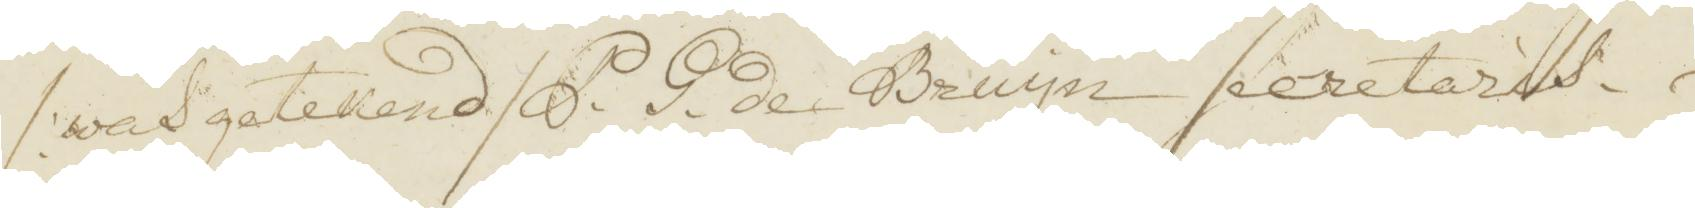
/: was getekend / P.P. de Bruijn secretaris.
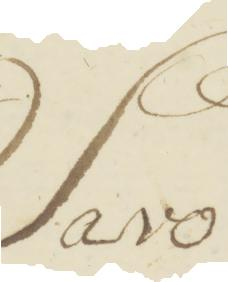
Savo
